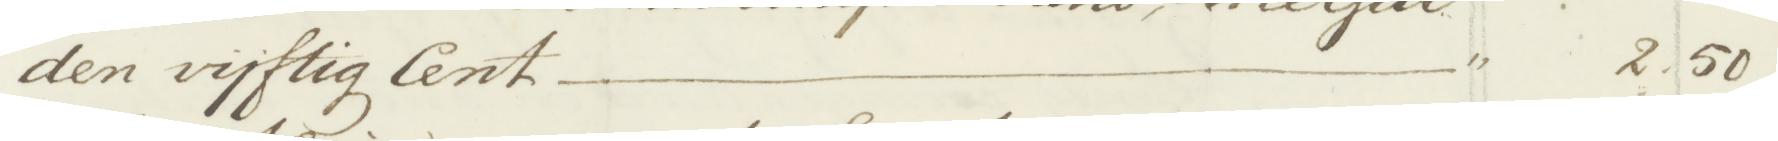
den vijftig Cent —„ 2.50
